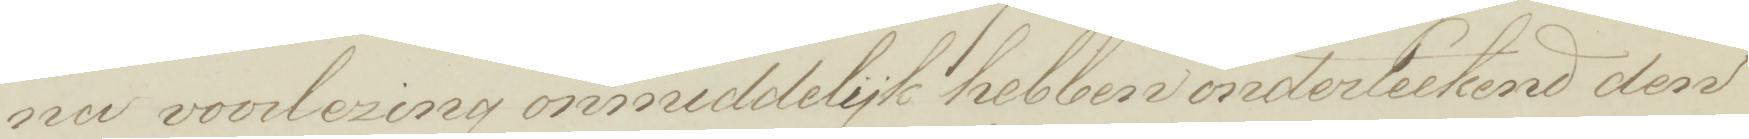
na voorlezing onmiddelijk hebben onderteekend den
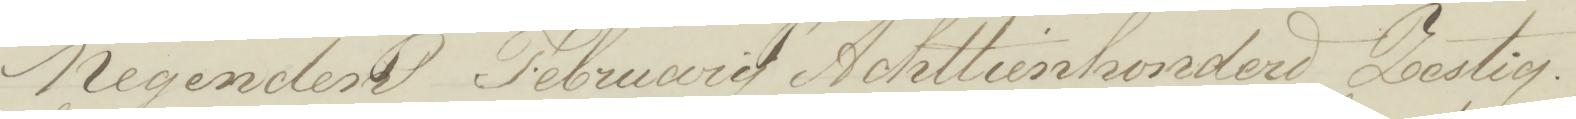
Negenden Februarij Achttienhonderd Zestig.
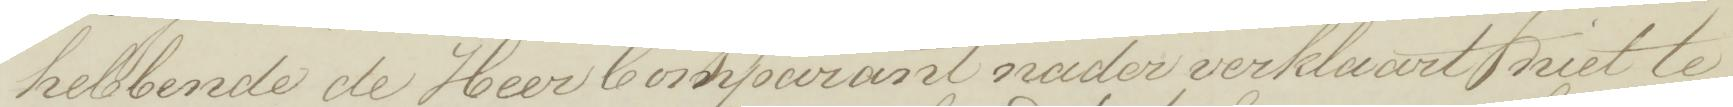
hebbende de Heer Comparant nader verklaart niet te
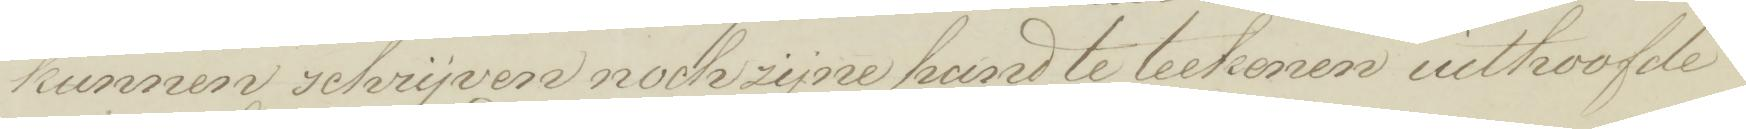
kunnen schrijven noch zijne hand te teekenen uithoofde
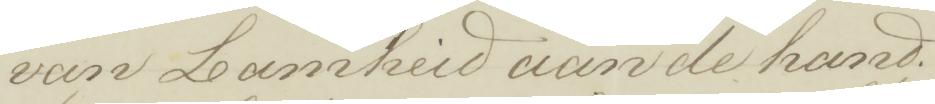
van Lamheid aan de hand.
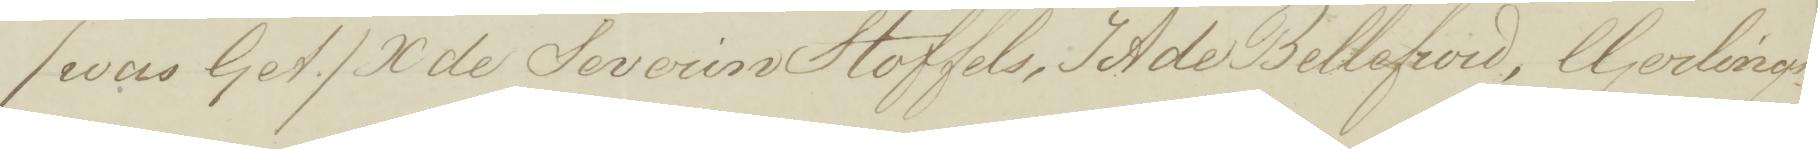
/was Get:/ X de Severin Stoffels, I A de Bellefroid, CGerling,
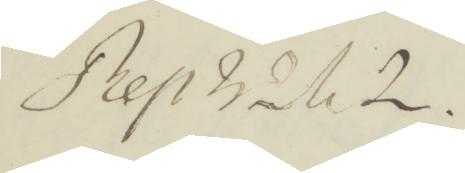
Rep 3242.
